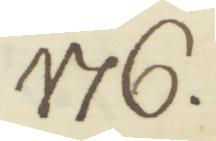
176.
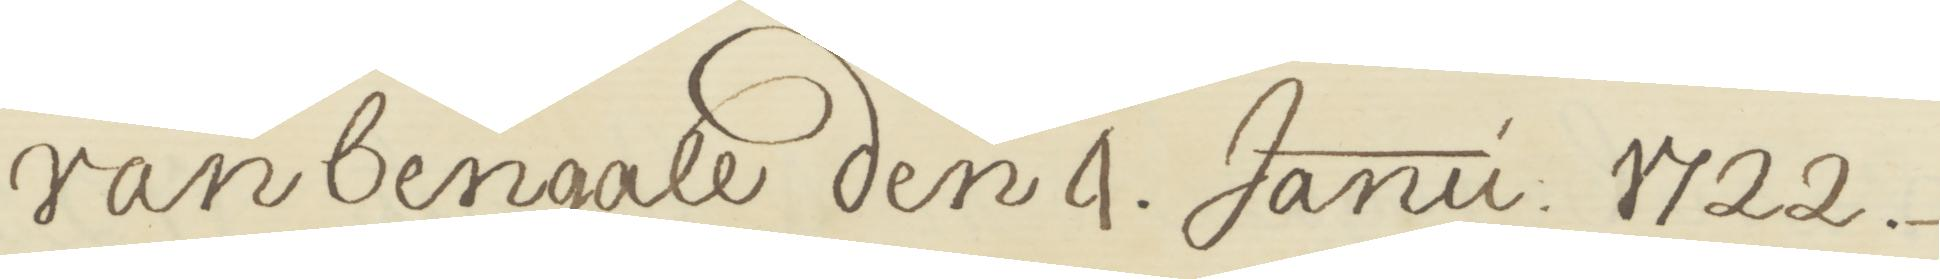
van bengale den 4. Janu: 1722.
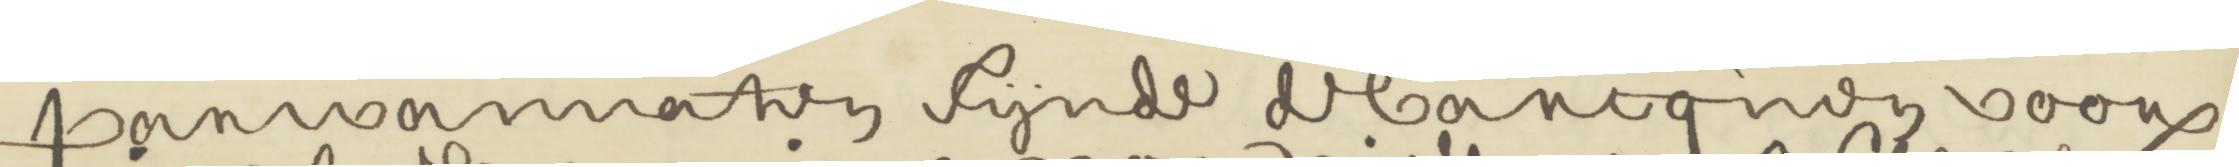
parwannaten Eijnde de barqeun voor
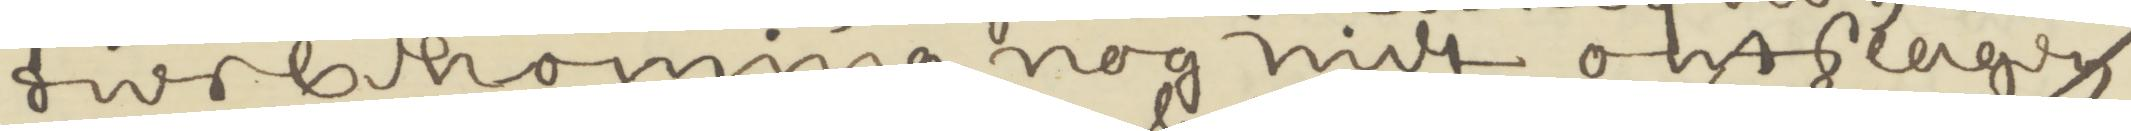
dies bekoming nog niet ontslagen
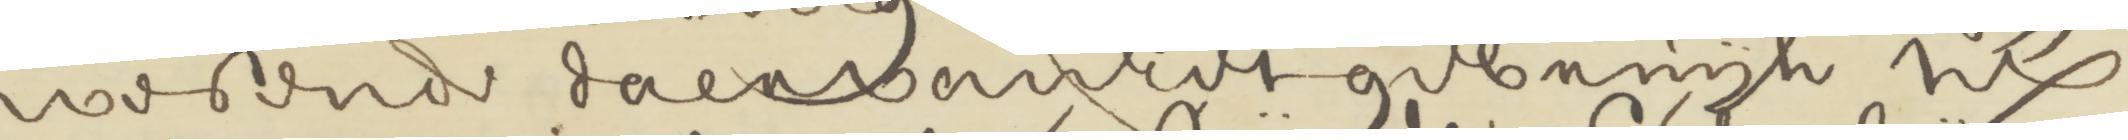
wesende daervan het gebruijk te
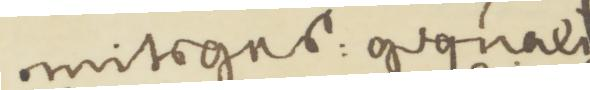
mitsgrs: gequali
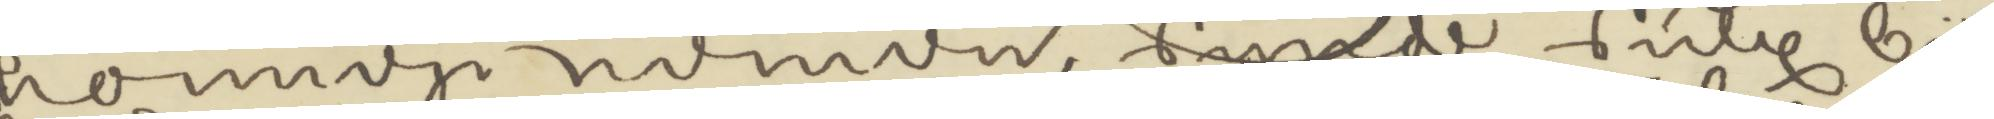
konnen nemen, sijnde sulx bij
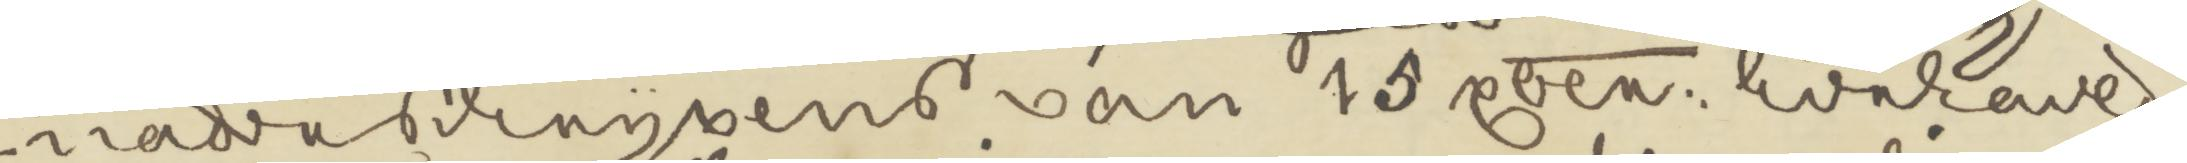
nader schrijvens van 15 xber: herhaeld
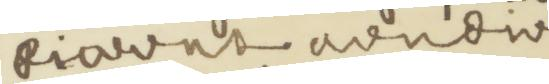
ficeert aen dies
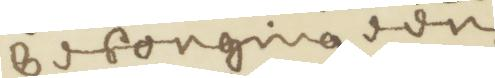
besorging een
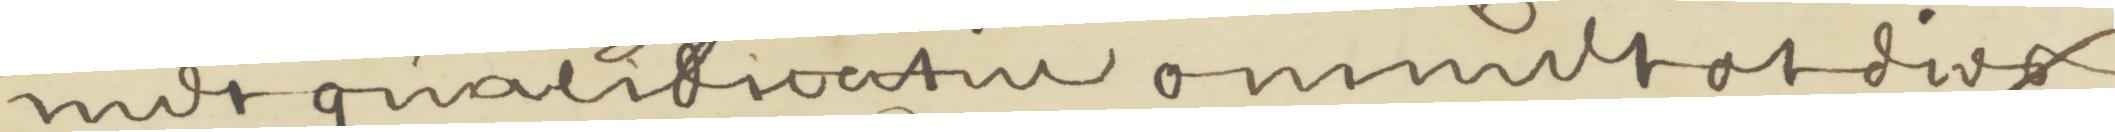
met qualificatie omme tot dies
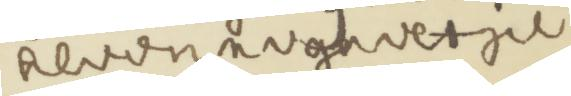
kleen regaeltje
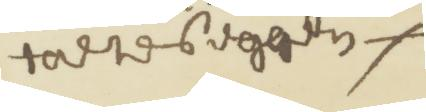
toeteseggen
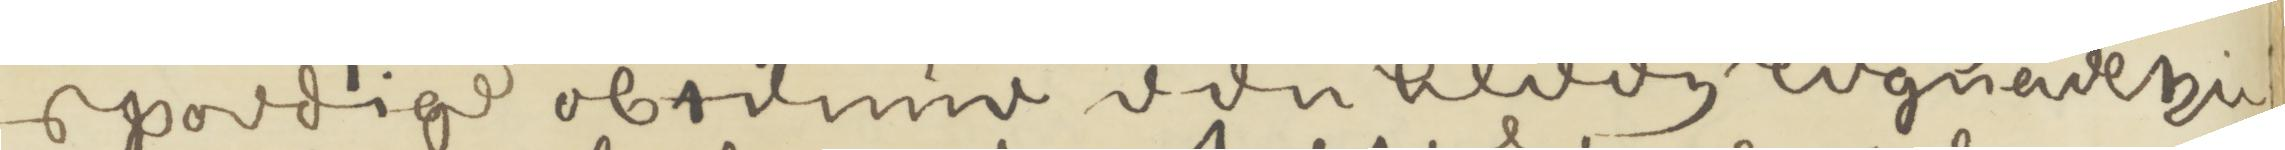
spoedige obtinue een kleen reguaeltje
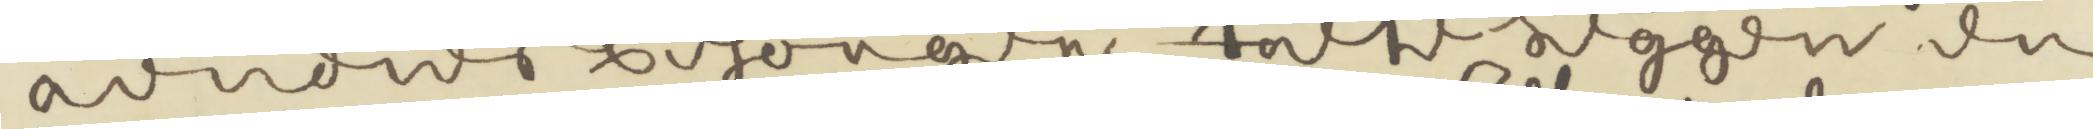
aen dies besorgen toe te seggen en
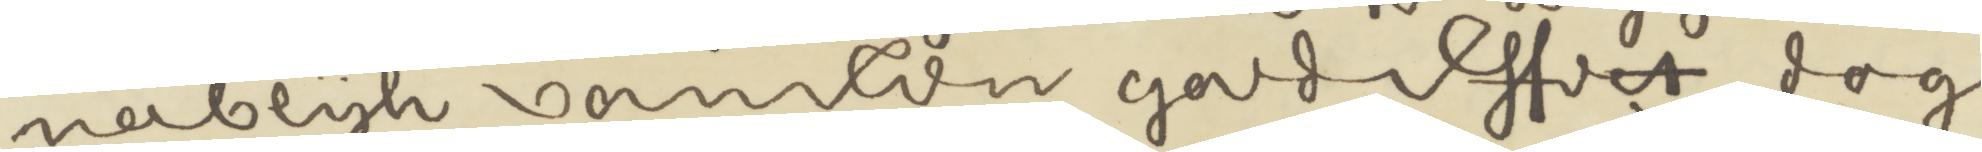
na blijk van Een goed Effect dog
